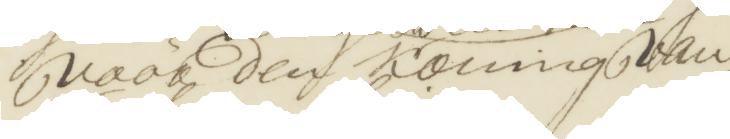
voor den koning van
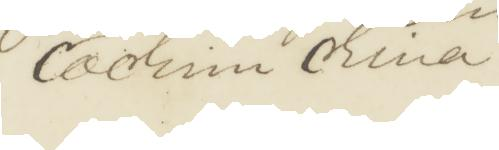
cochim china
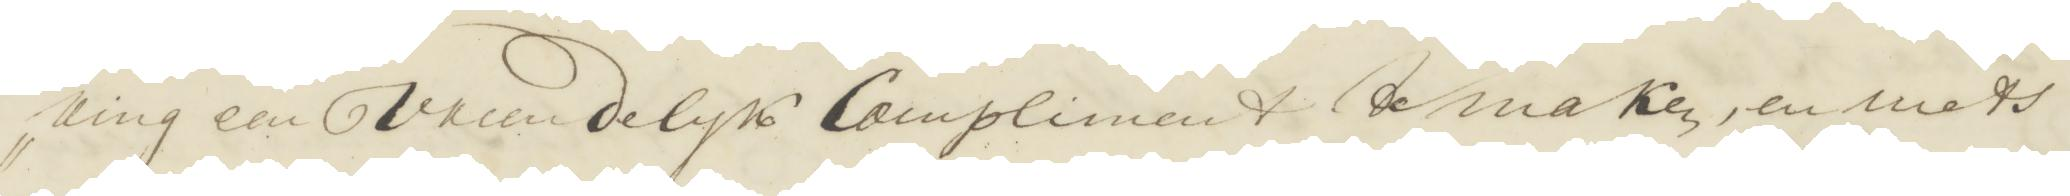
„ring een vriendelyk compliment te maken, en niets
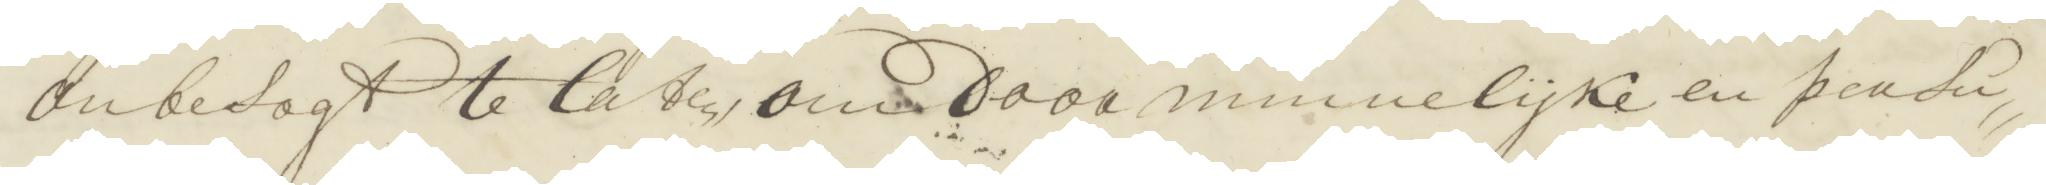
onbesogt te laten, om door minnelijke en persu„
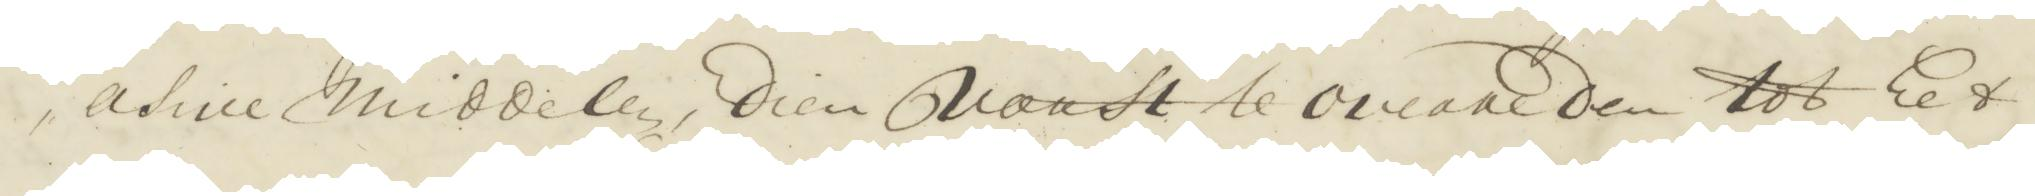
„ asive middelen, dien voost te overreden tot het
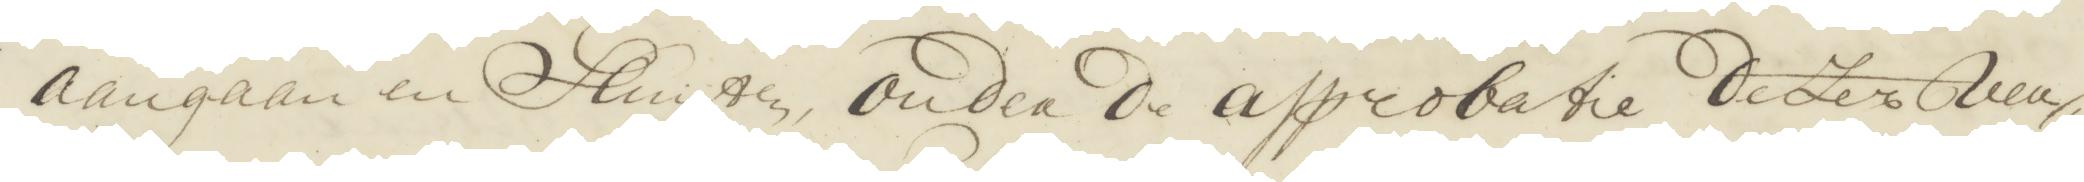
aangaan en sluijten, onder de approbatie dezer ver
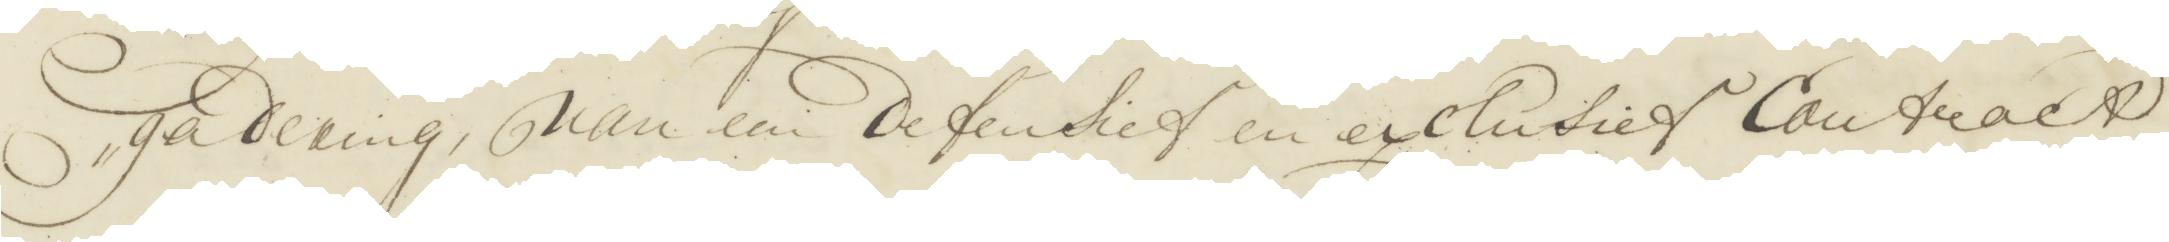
„gadering, van een defensief en exclusief contract
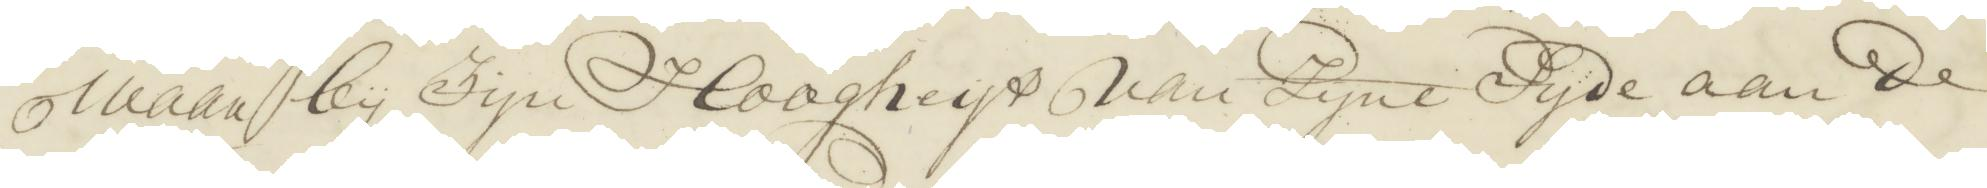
waar bij zijn Hoogheijt van zyne syde aan de
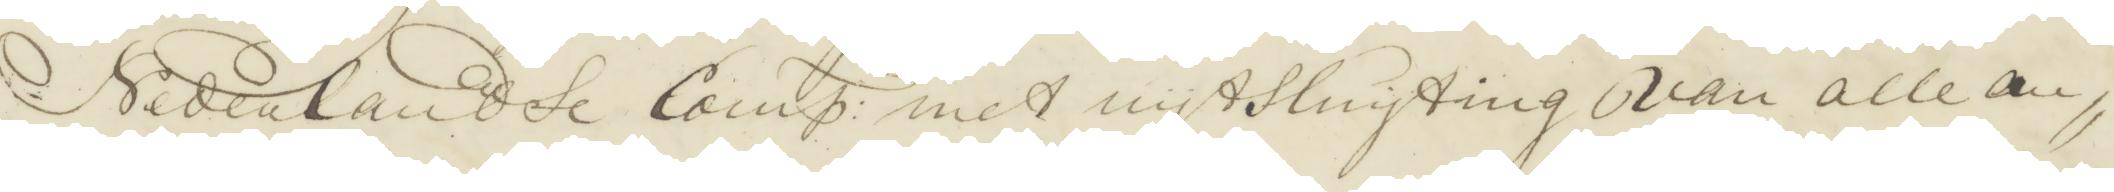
Nederlandse comp:s met uijtsluijting van alle an„
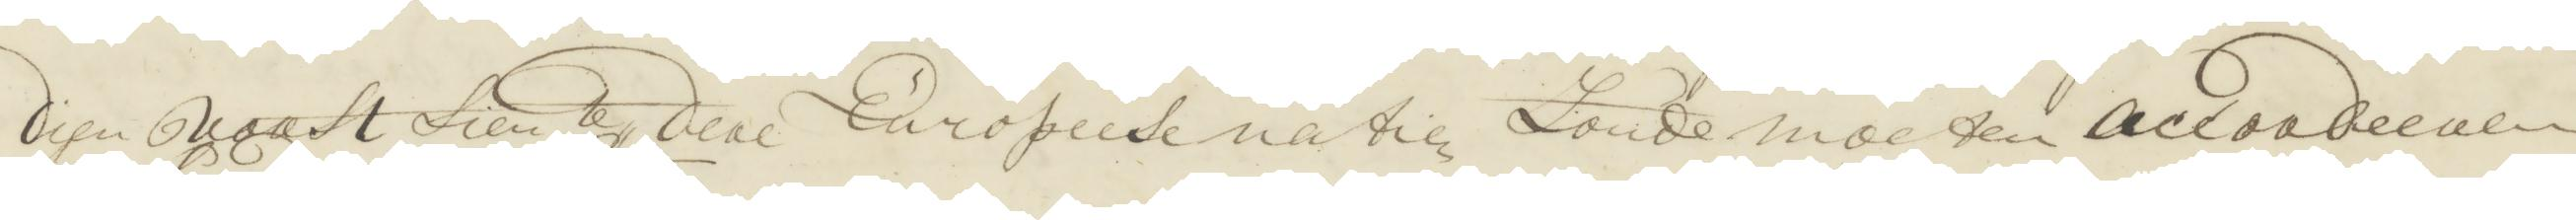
dien vorst sien te „dere Europeese natien zoude moeten accordeeren
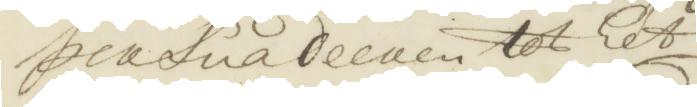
persuadeeren tot het
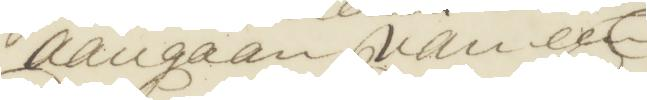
aangaan van een
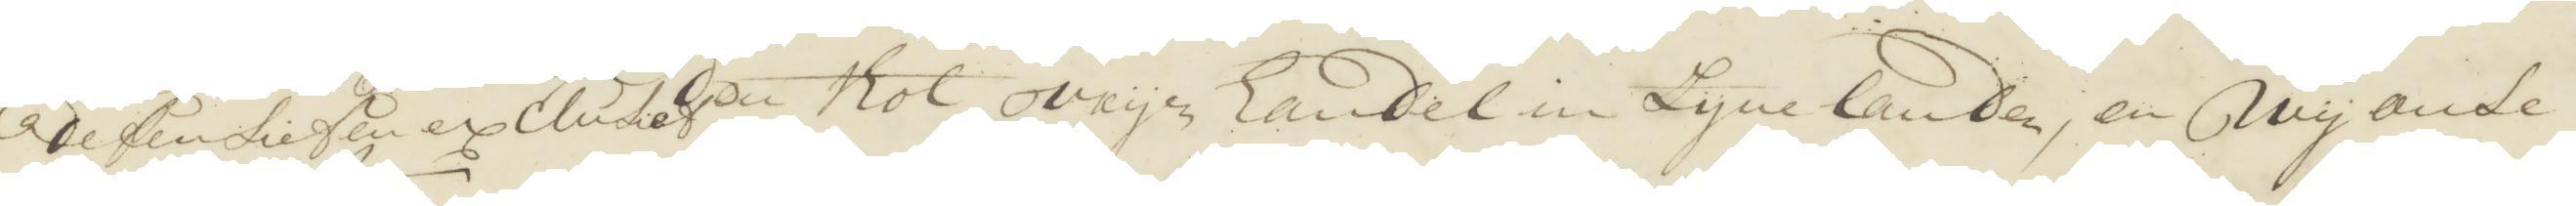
defensiefen exclusief den thol vrijen handel in zijne landen, en wij onse
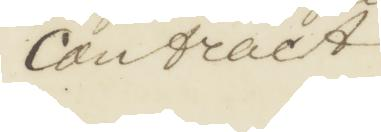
contract
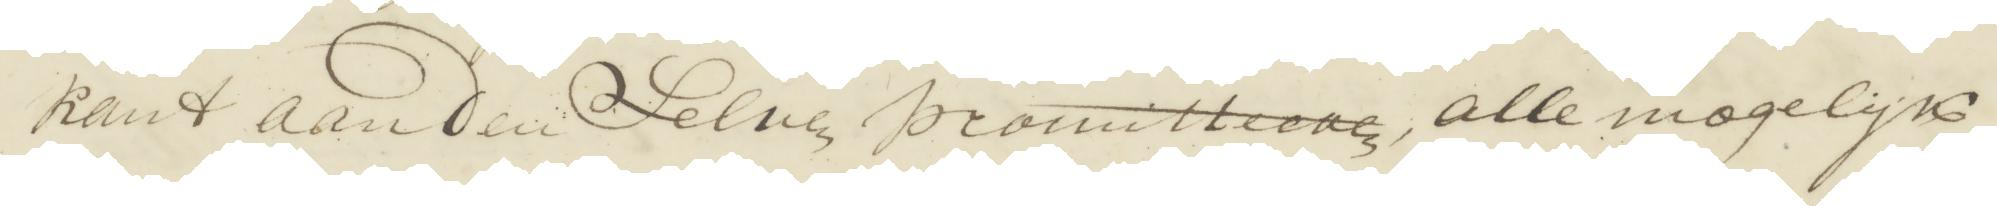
kant aan den selven promitteeren, alle mogelijk
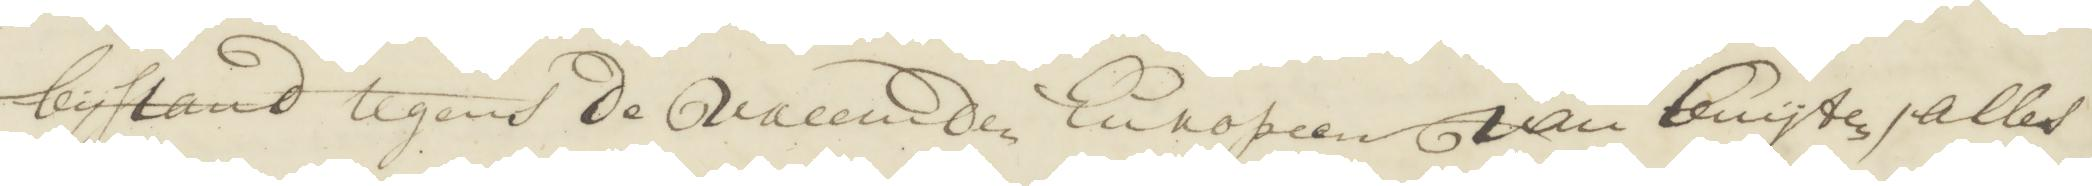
bijstand tegens de vreemde Europeen van buijten, alles
